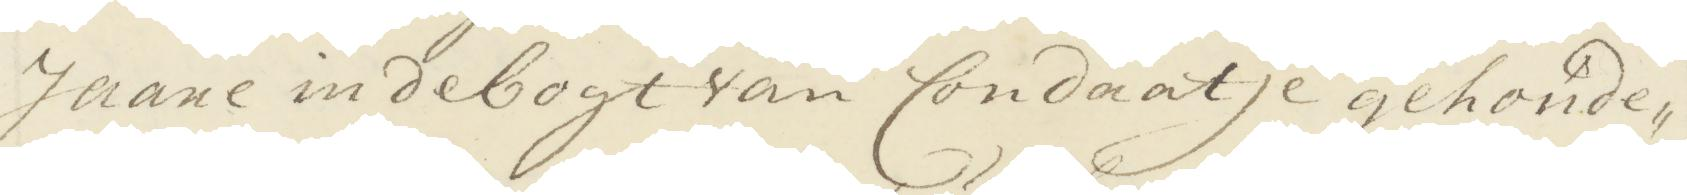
Jaare in de bogt van Condaatje gehoude„
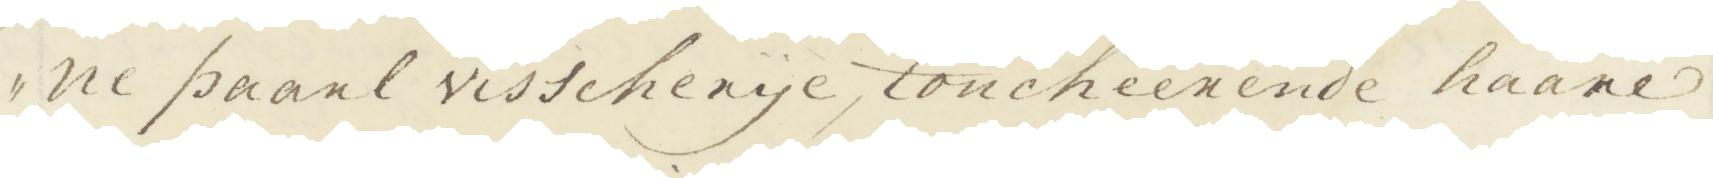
„ne paarl visscherije, toucheerende haare
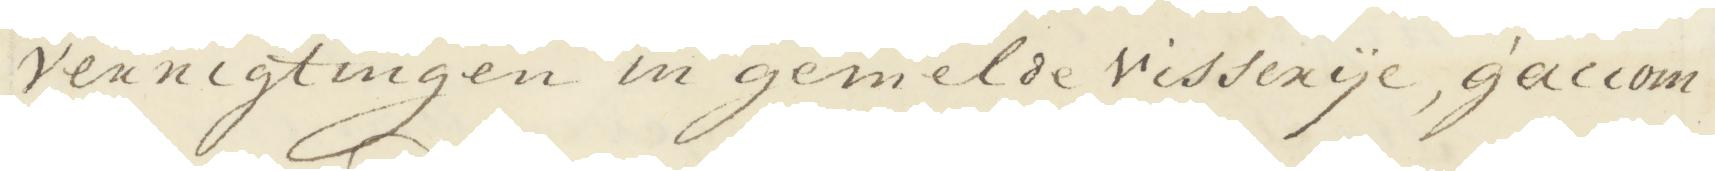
vernigtingen in gemelde visserije, g'accom
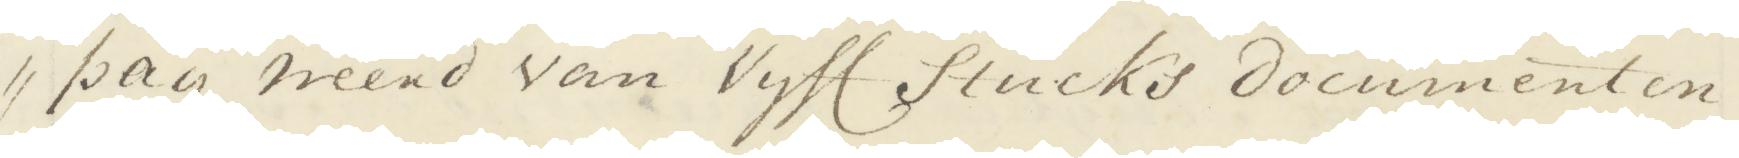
„pagneerd van vyff stucks documenten
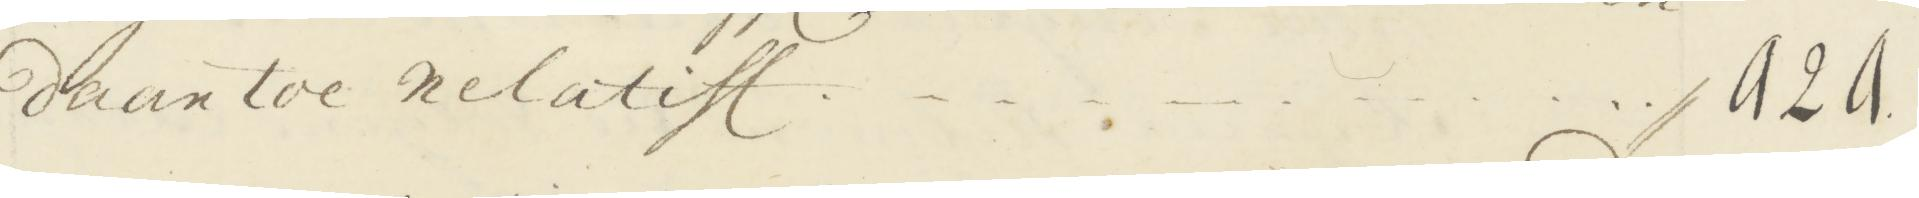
daar toe relatiff . - - - - - - - - . . . . „424.
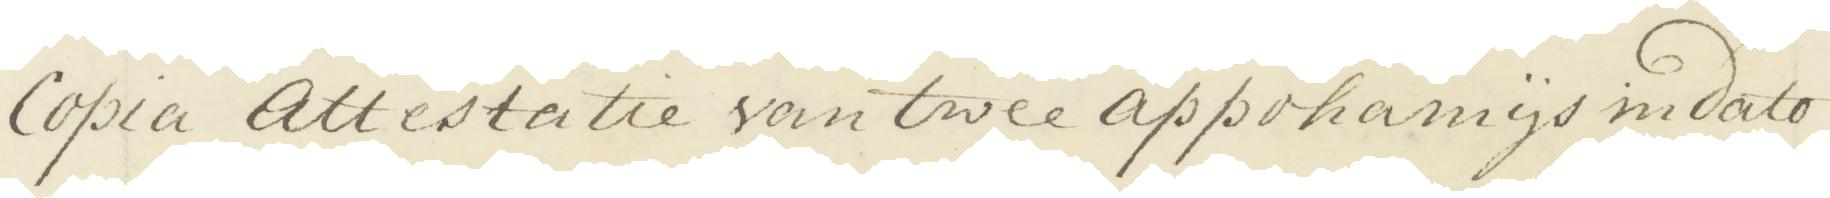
Copia Attestatie van twee appohamijs in dato
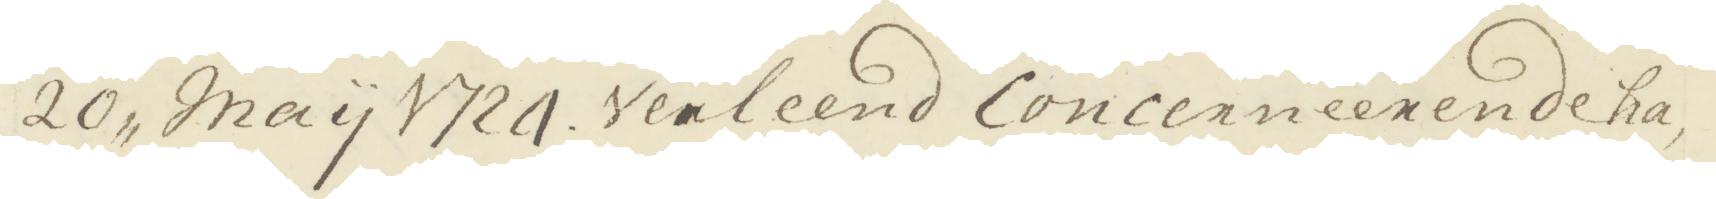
20„ Maij 1724. verleend concerneerende ha„
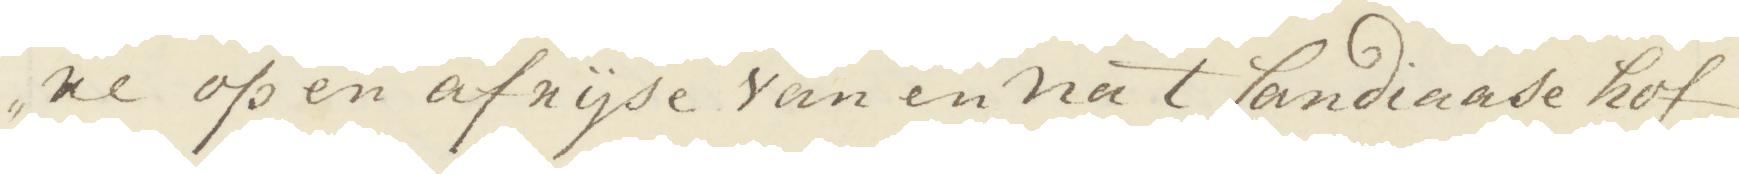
„re op en afrijse van en na ’t Candiaase hof
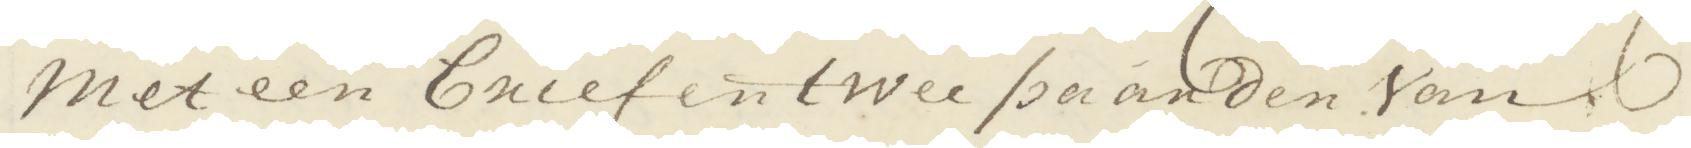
met een brief en twee paarden van:
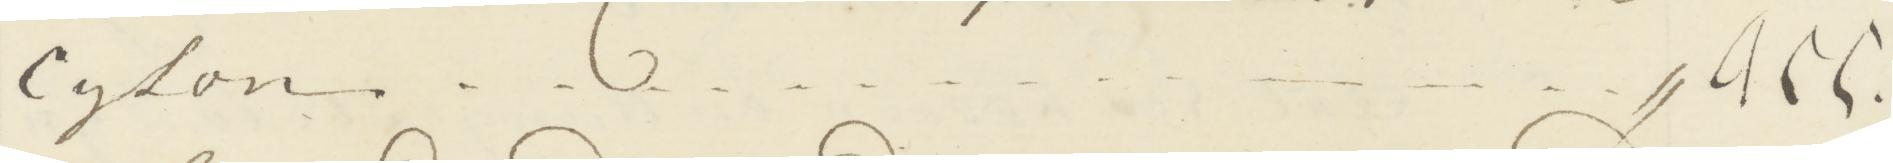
Cylon - - - - - - - - - - - - - -„455.
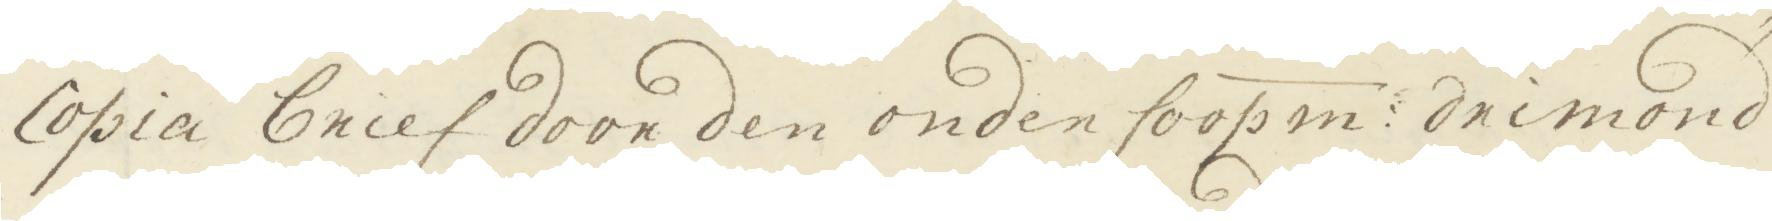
Copia brief door den onder Coopm: drimond
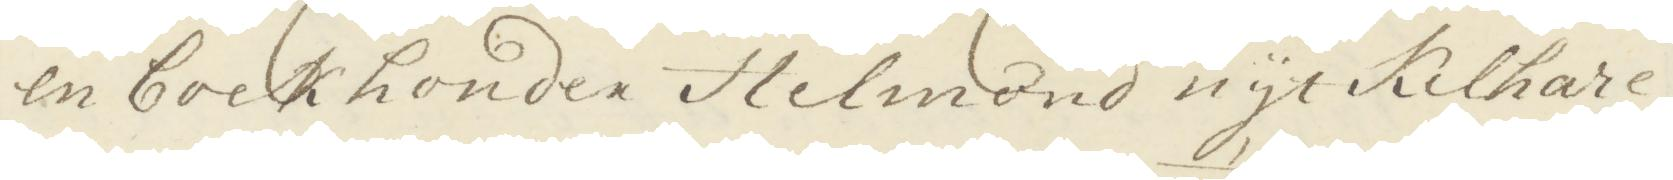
en boekhouder Helmond uijt Kilhare
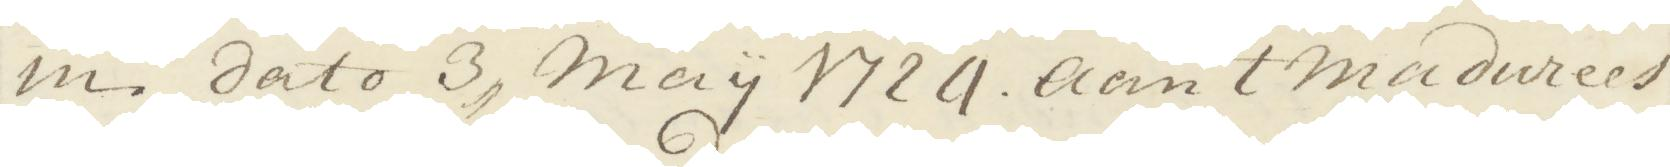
in dato 3„ Maij 1724. aan ’t madurees
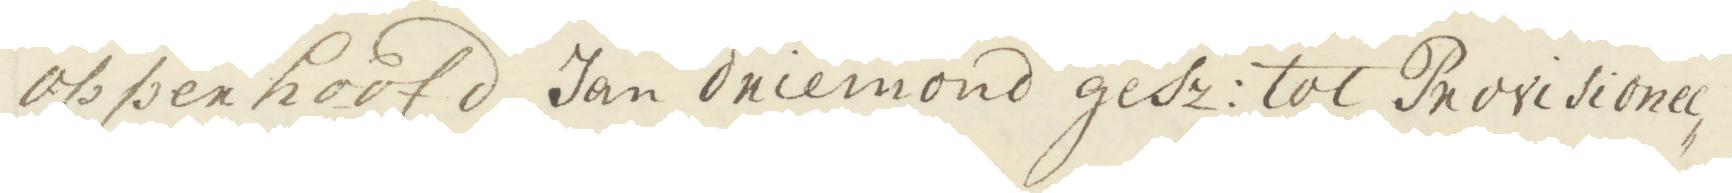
opperhoofd, Ian driemond gesz: tot Provisionee„
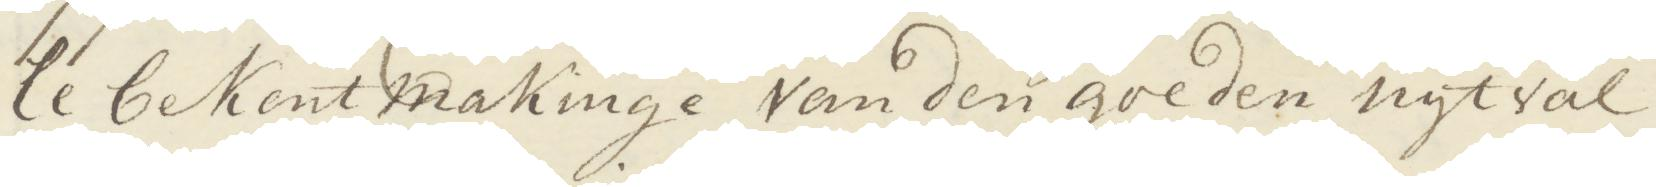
le bekentmakinge van den goeden uijtval
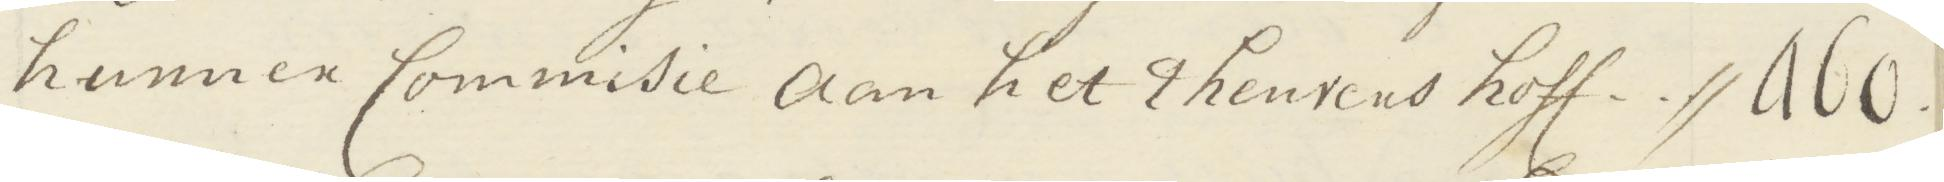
hunner Commisie aan het theuvers hoff-..„460.
